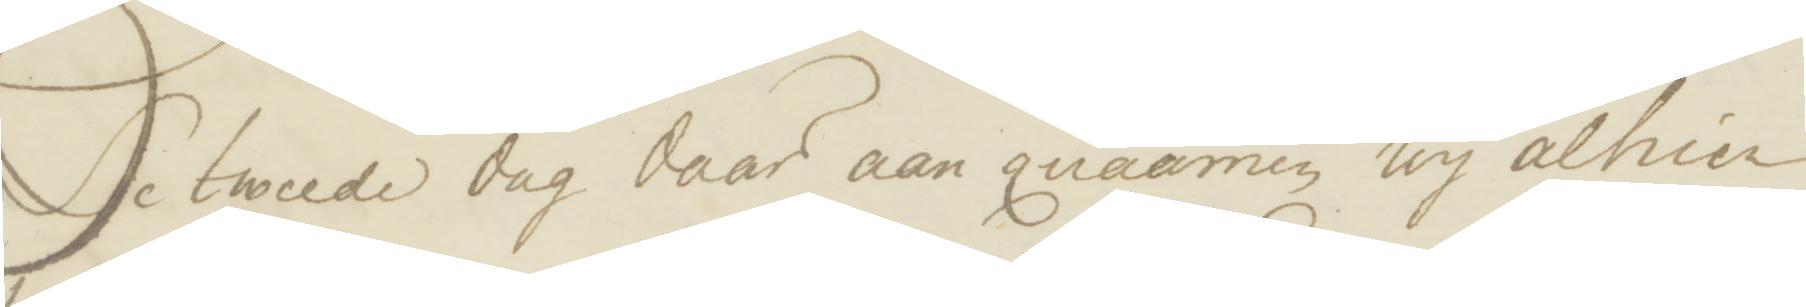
De tweede dag daar aan quaamen wy alhier
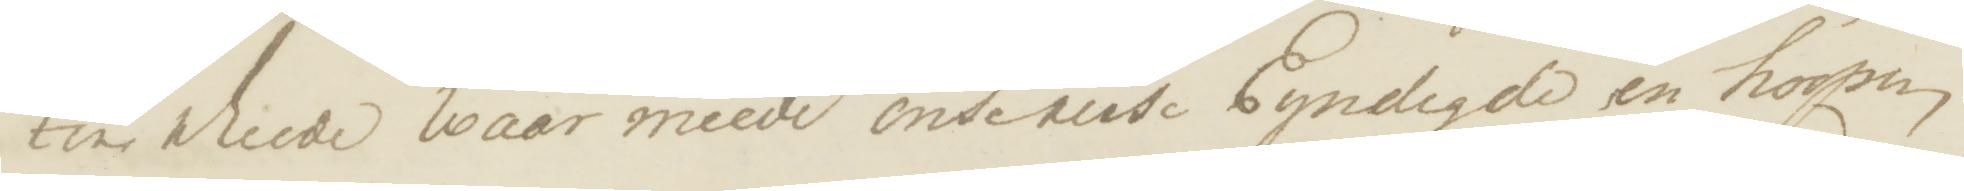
ter rheede waar meede onse reise Eyndigde en hoopen
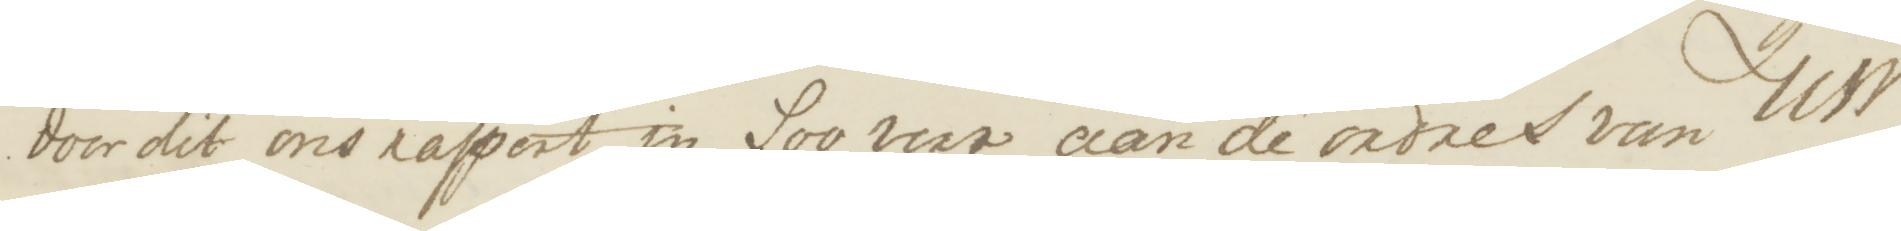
door dit ons rapport in soo vort aan de ordres van UW
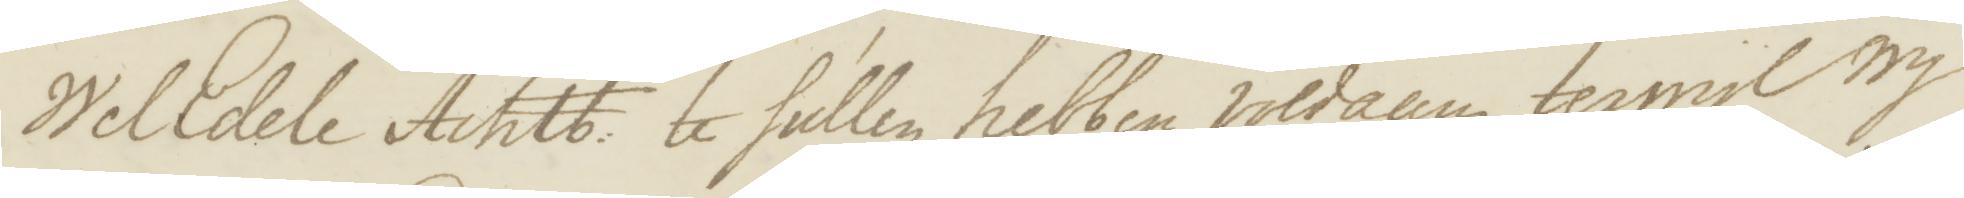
WelEdele Achtb: te sullen hebben voldaan terwijl wy
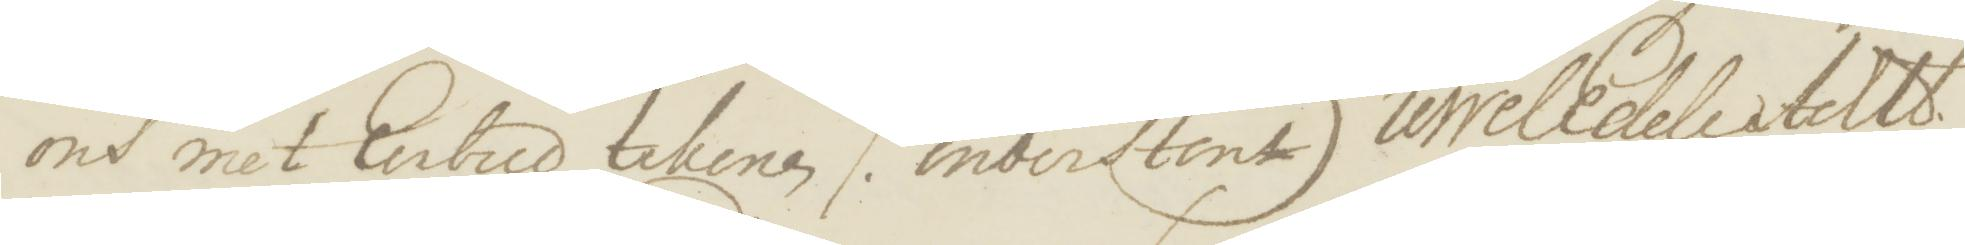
ons met Eerbied tekenen /.onderstont) UWelEdele Achtb.
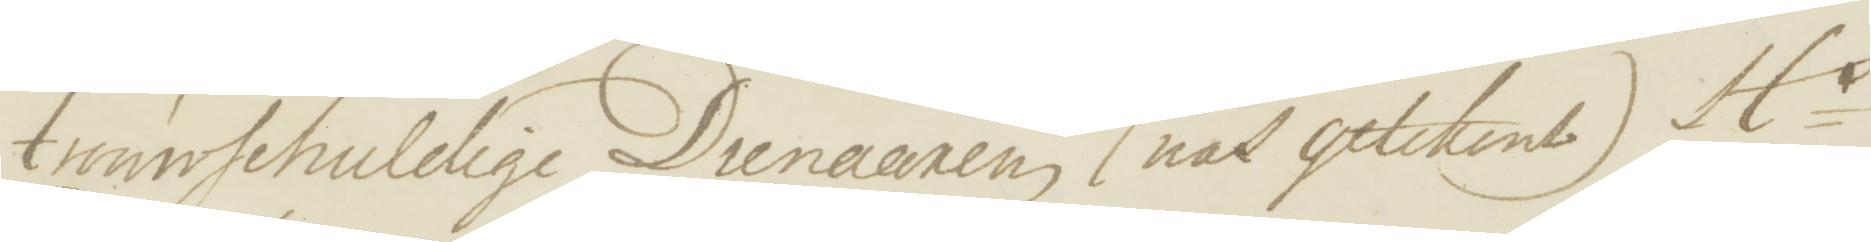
trouwschuldige Dienaaren, (was getekent) H=s
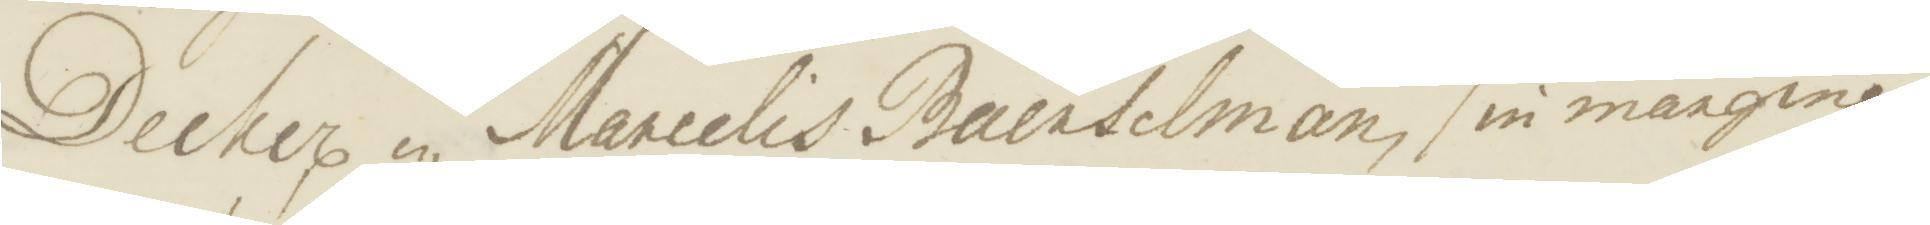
Decker en Marcelis Baerselman, / in margine)
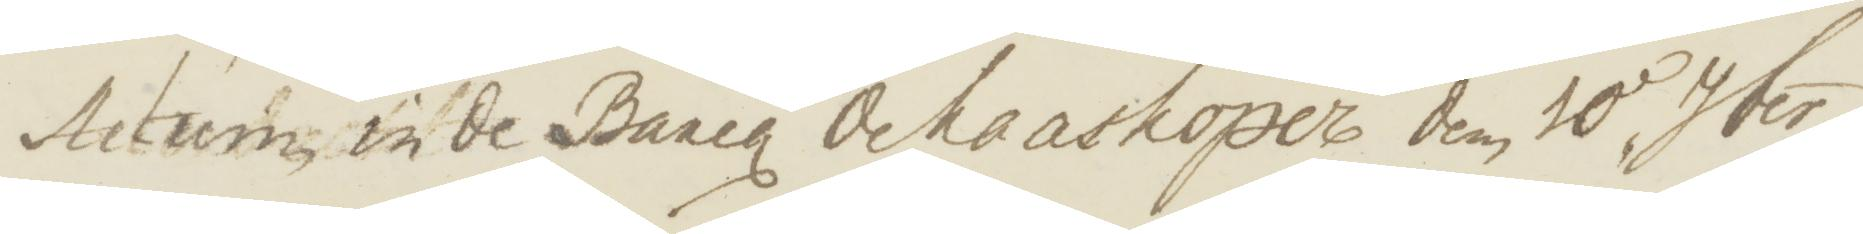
Actum in de Barcq de kaaskoper den 10„e 7ber:
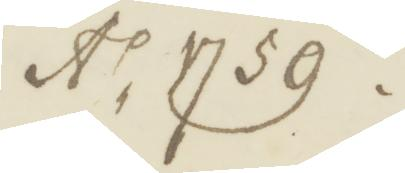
A„o 1759.
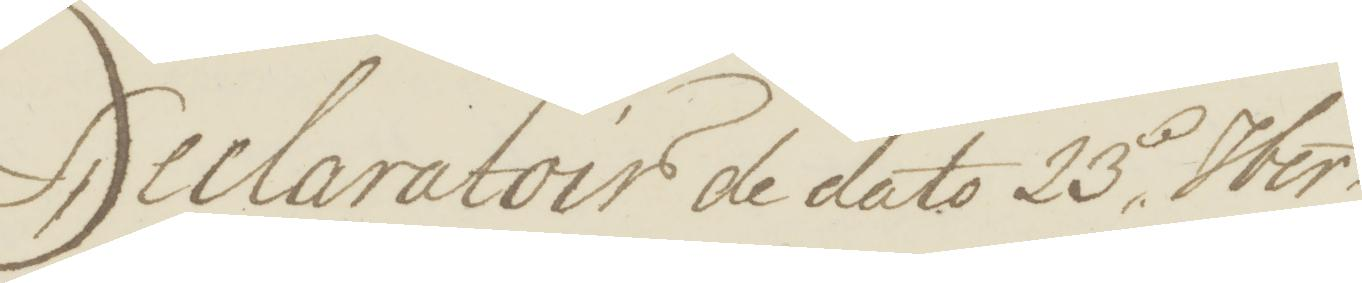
Declaratoir de dato 23„e 7ber.
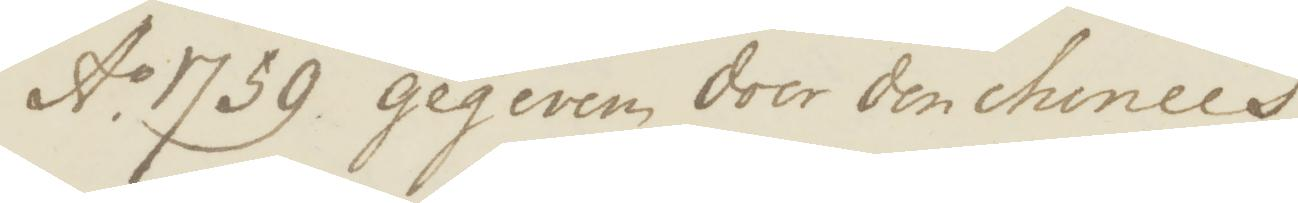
A,o 1759. gegeven door den chinees
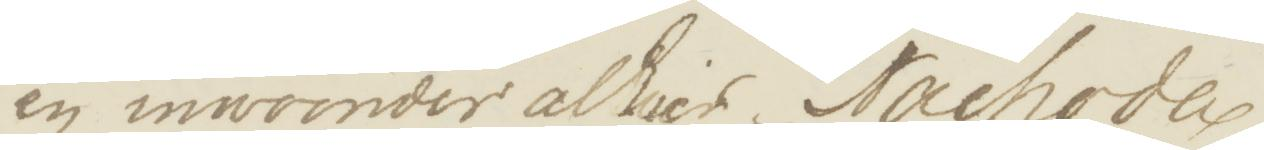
en inwoonder alhier Nachoda
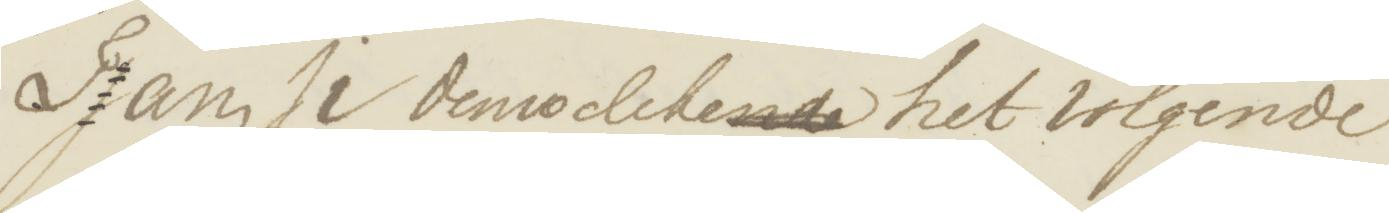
Sjam Ji denwelckendende het volgende
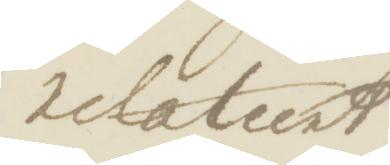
relateert
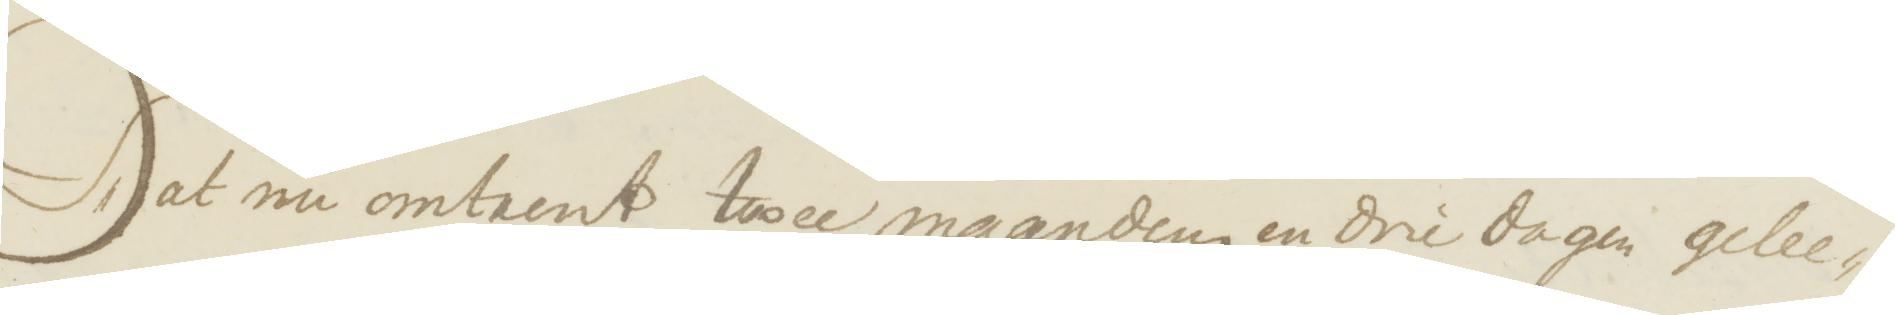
Dat nu omtrent twee maanden, en drie dagen gelee„
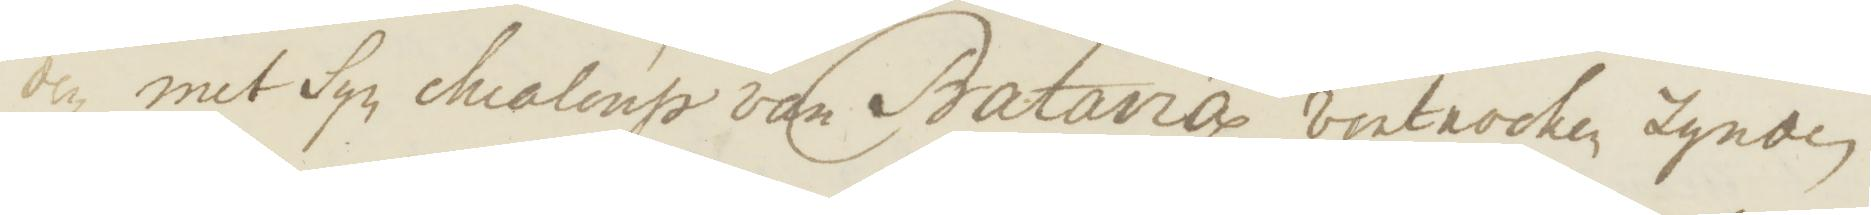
den met syn chialoup van Batavia vertrocken zynde,
